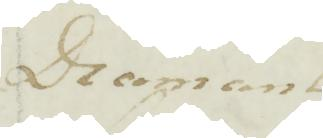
Diamant
